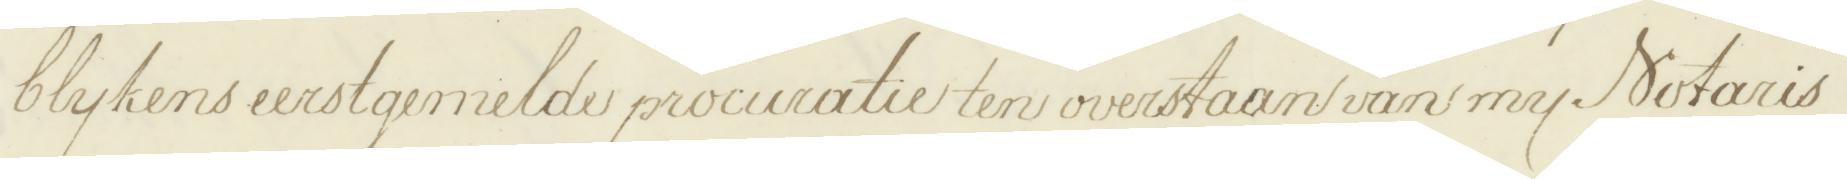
blykens eerstgemelde procuratie ten overstaan van my Notaris
